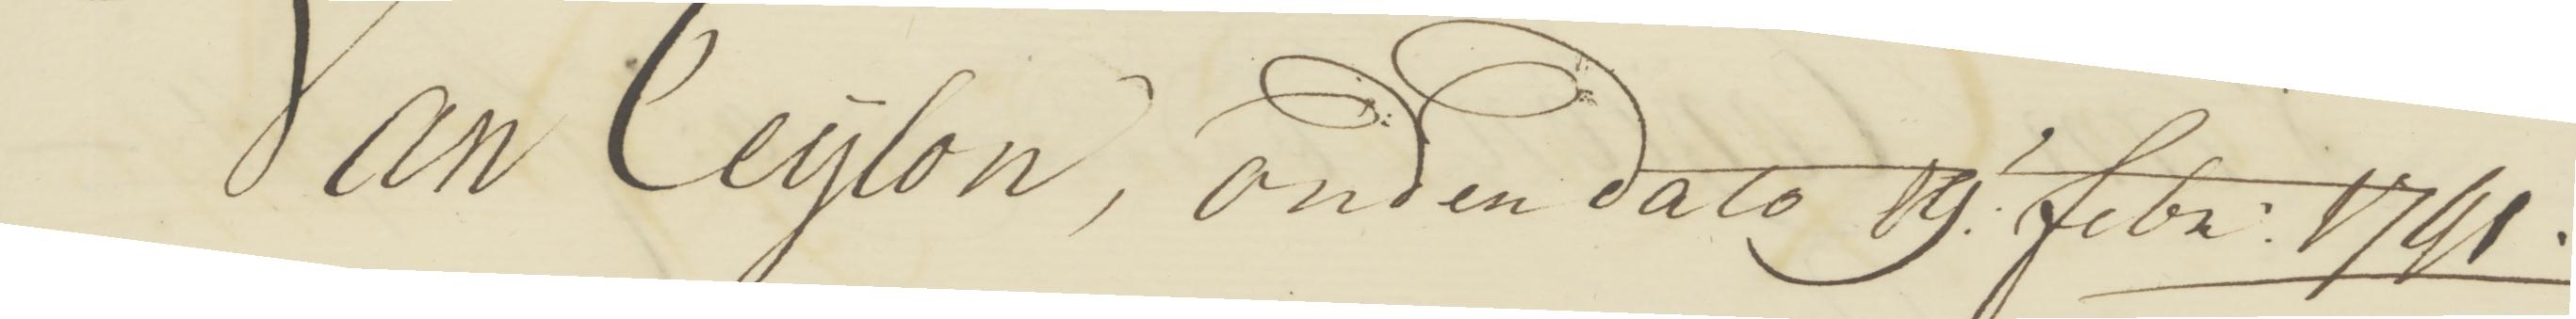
Van Ceijlon, onder dato 19:' Febr: 1741.
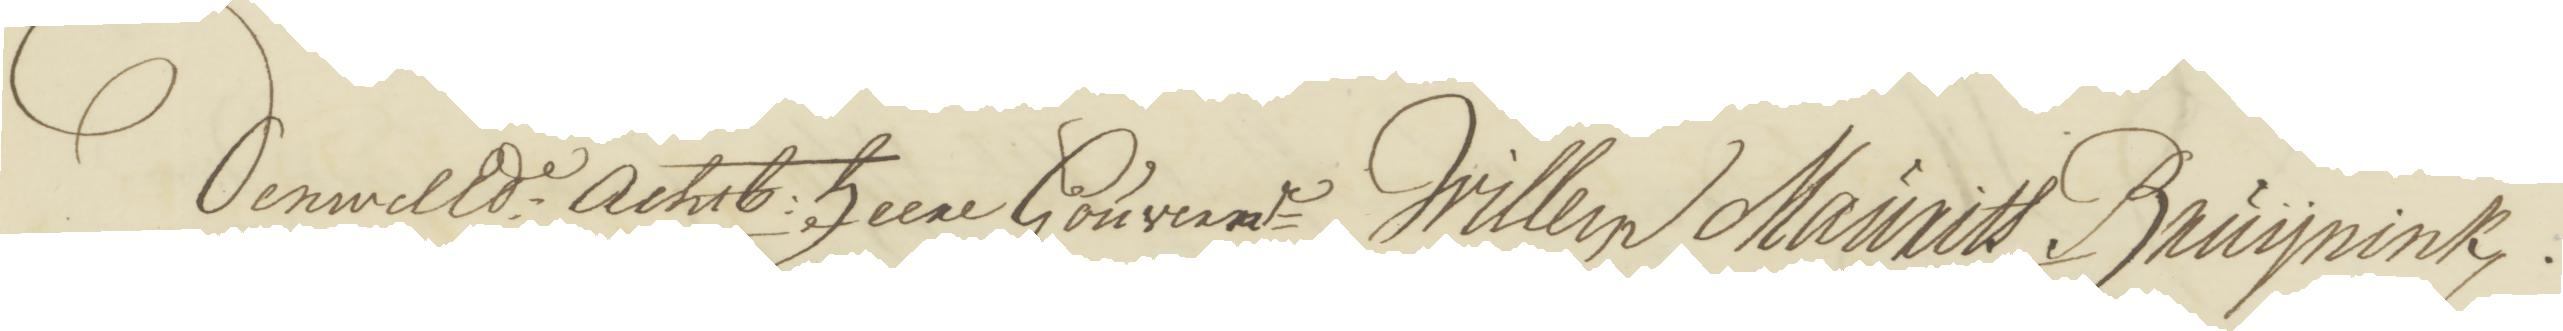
Denwel Ed=e Achtb: Heere Gouvern=r Willem Maurits Bruijnink.
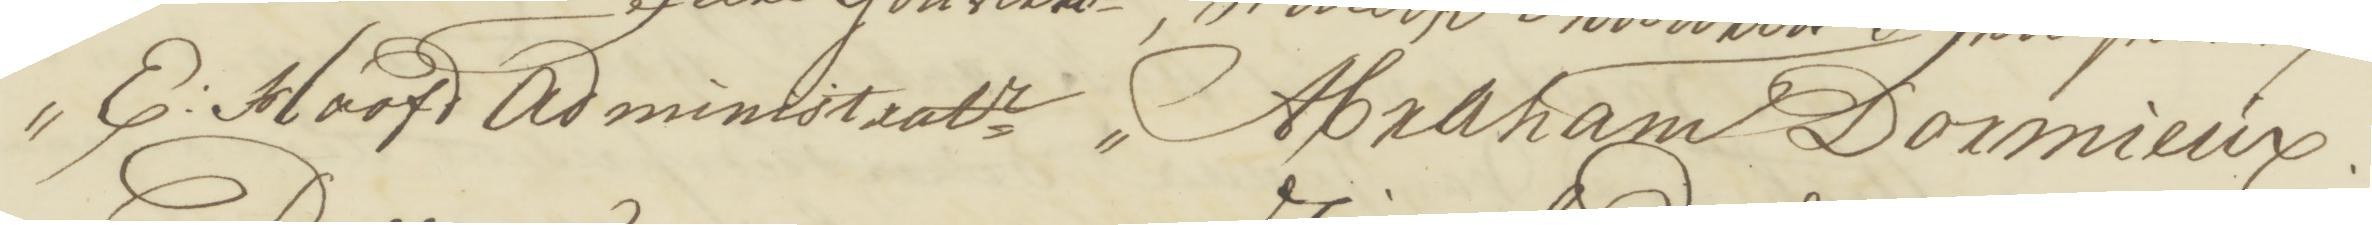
„ E: Hoofd Administrat=r „ Abraham Dormieux.
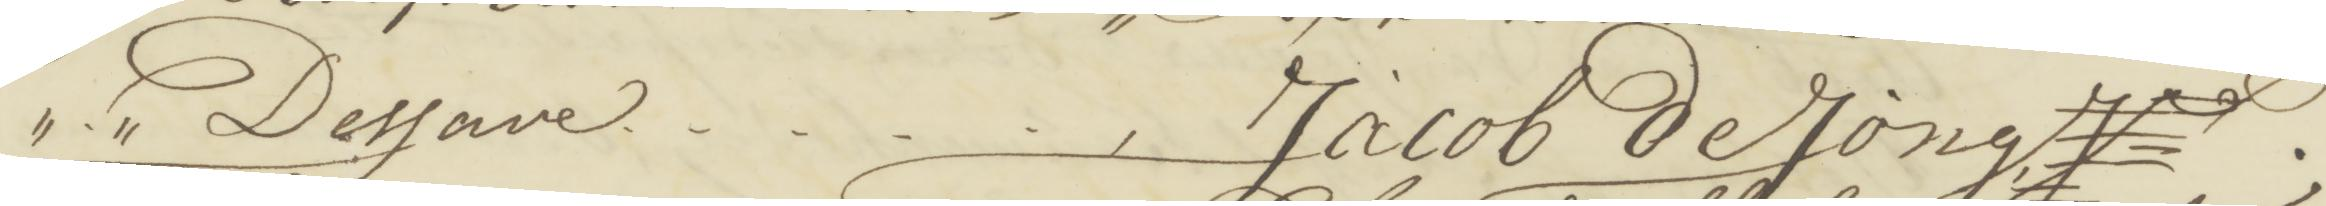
„ . „ Dessave . . . . . , Jacob de Jong J=r.
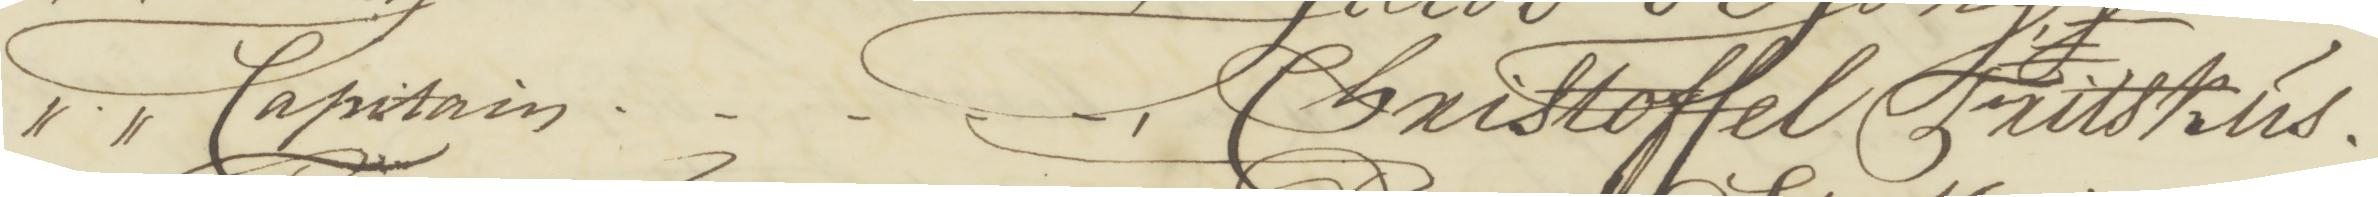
„ . „ Capitain . _ _ _ _ , Christoffel Fritskus.
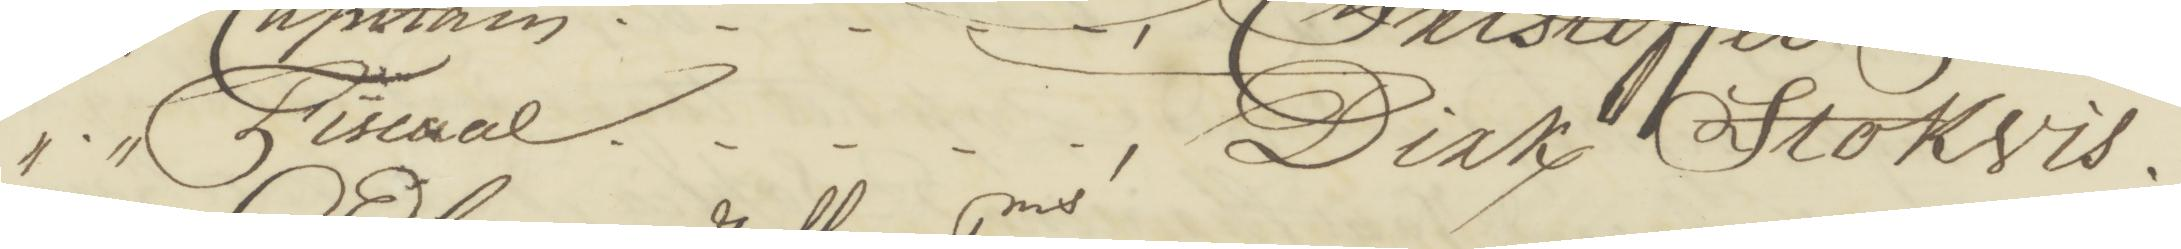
„ . „ Fiscaal . _ _ _ _ , Dirk Stokvis.
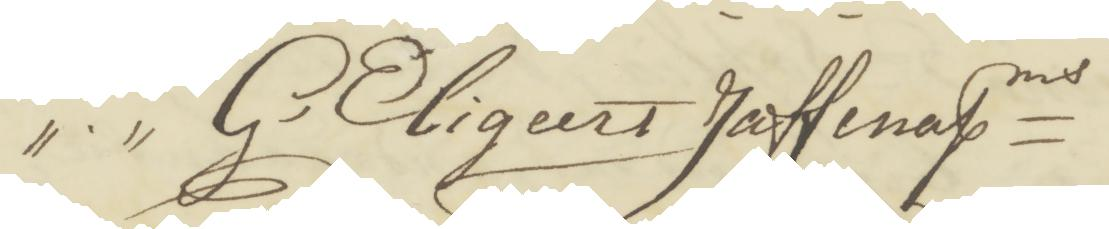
„ . „ G' Eligeert Jaffenap=ms
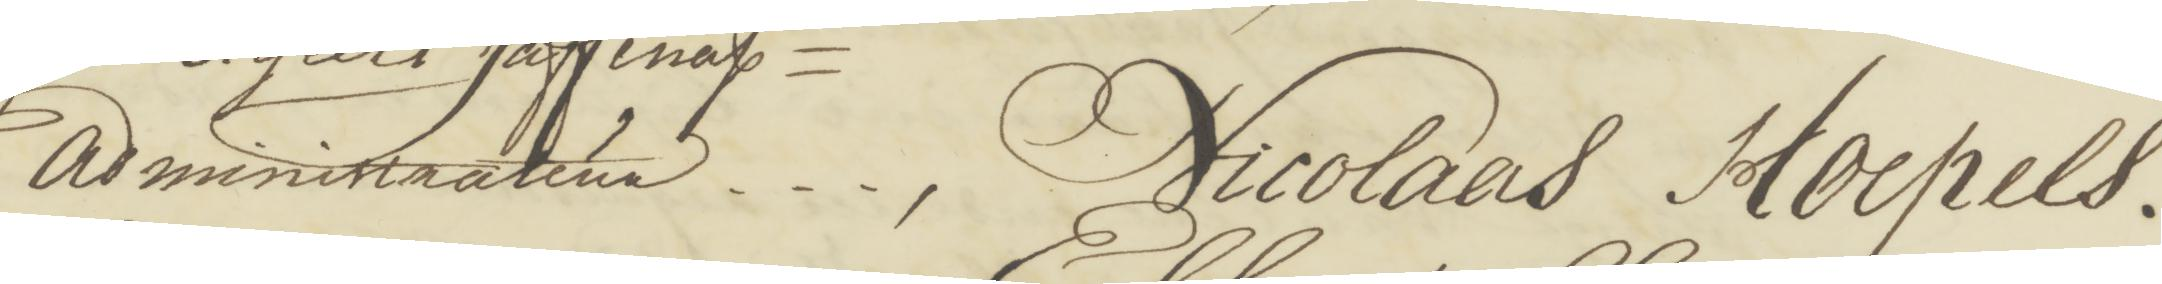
Administrateur _ _ _ , Nicolaas Hoepels.
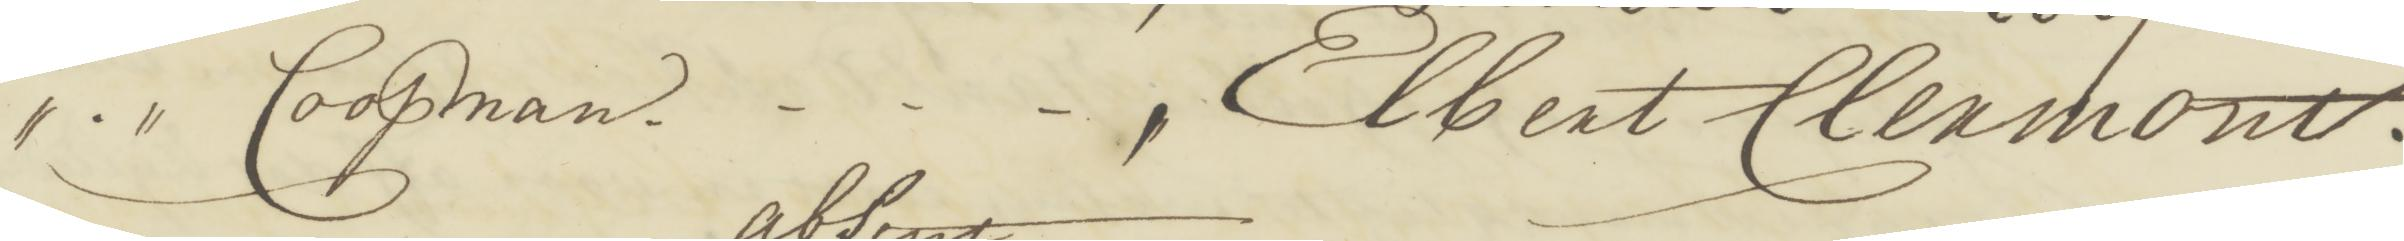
„ . „ Coopman _ _ _ _ , Elbert Clermont
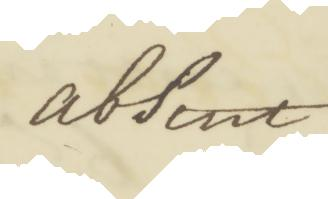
absent.
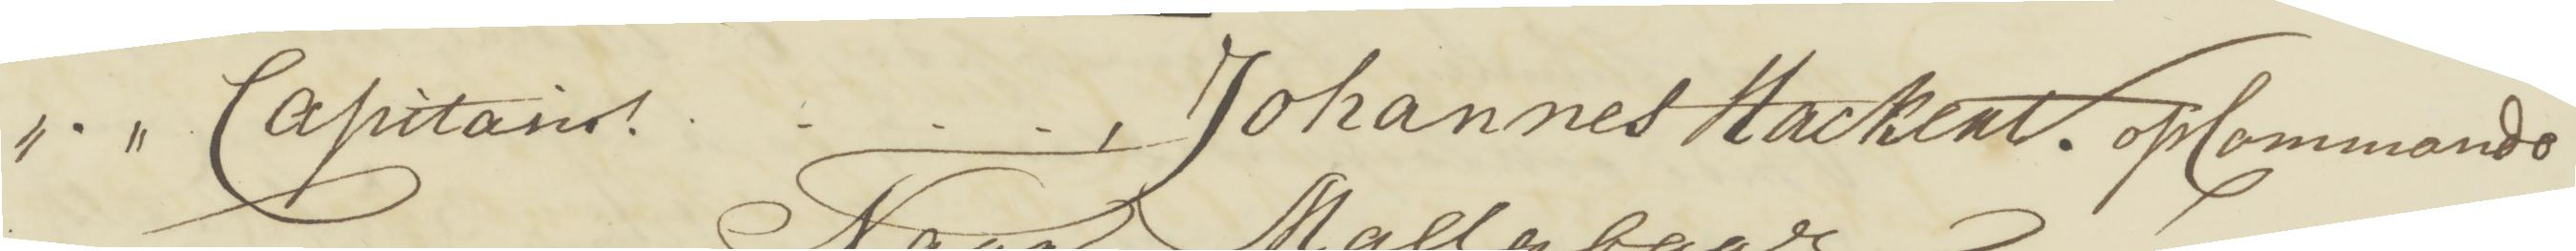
„ . „ Capitains . . . . , Johannes Hackert. op Commando
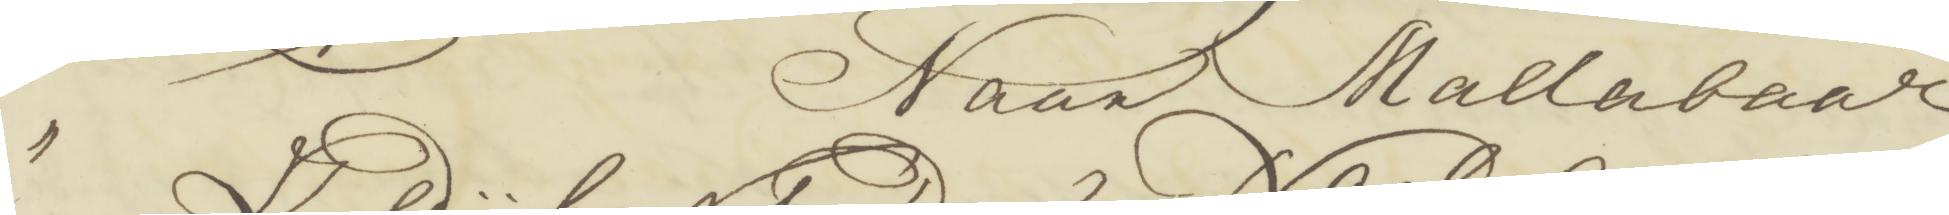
„ Naar Mallabaar
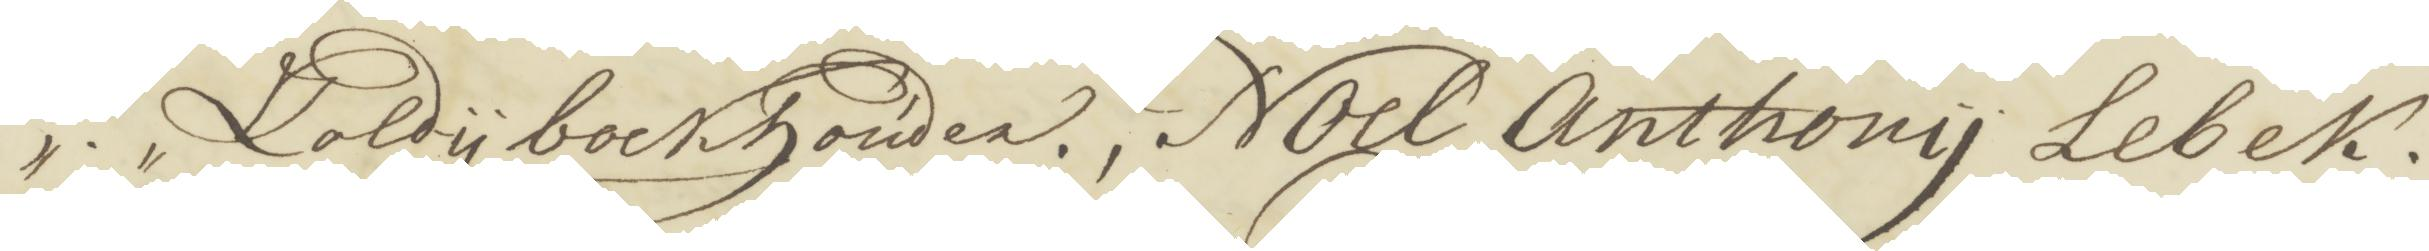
„ . „ Zoldij boek houder., Noel Anthonij Lebek.
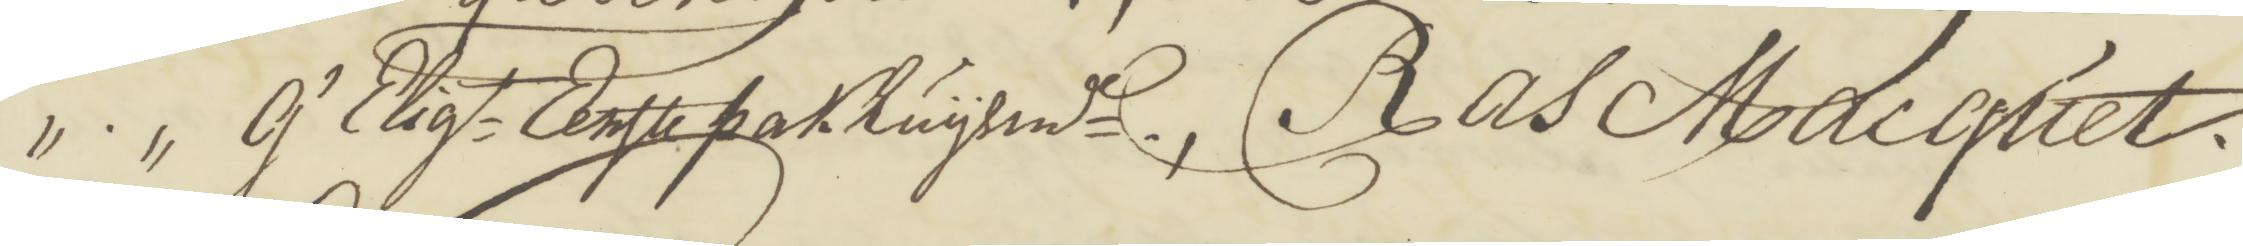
„ . „ g' Elig=t Eerste pakhuijsen=r . , Ras Macquet.
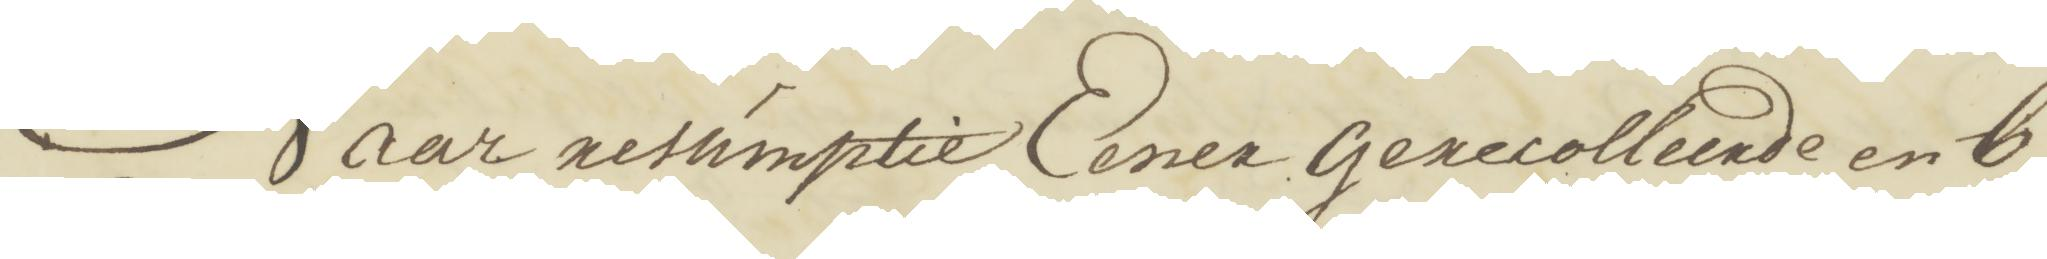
Naar retumptie Eener Gerecolleerde en b'
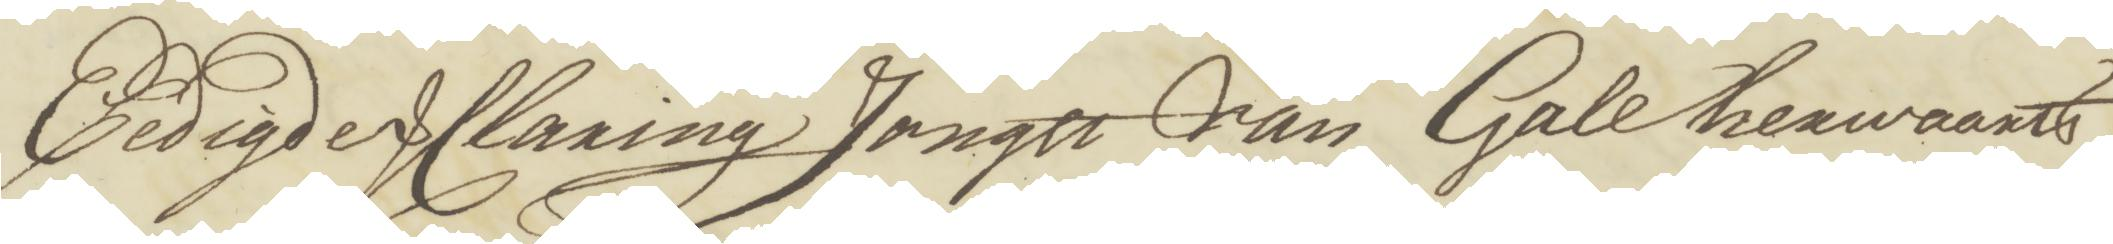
Eedigde verclaring Jongst van Gale herwaarts
